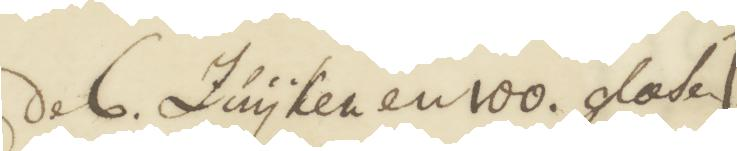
de 6. Zuijker en 100. glasen
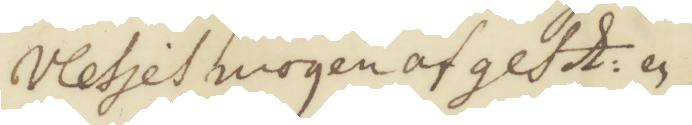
vlesjes mogen af gesch: en
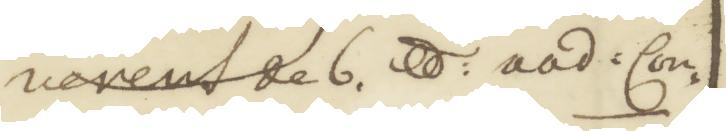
nevens de 6. lb: rad: Con„
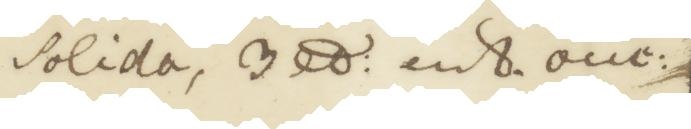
solida, 3 lb: en 8. onc:
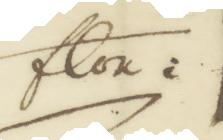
flor:
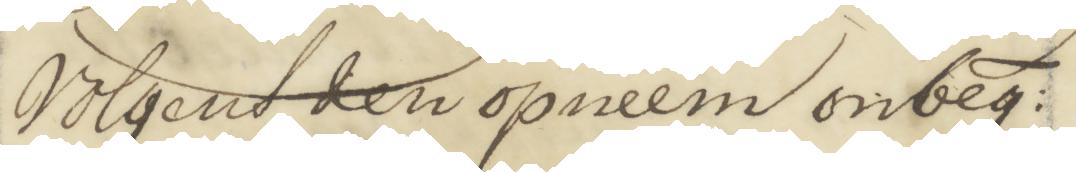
volgens den opneem onbeq:
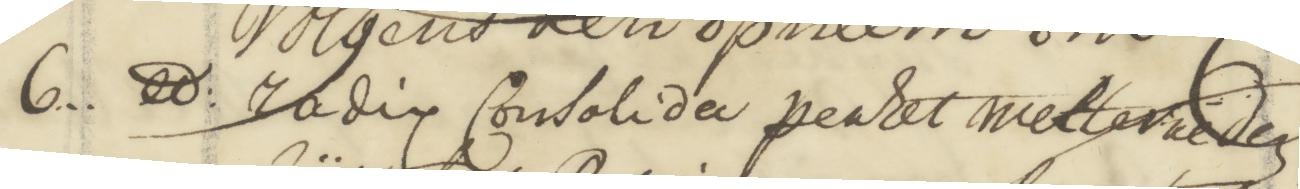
6. lb: radix Consolida perhet weltevreden
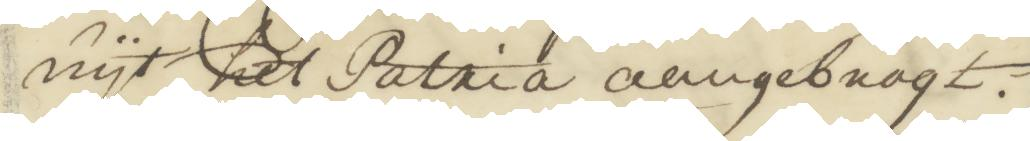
uijt het Patria aangebragt.
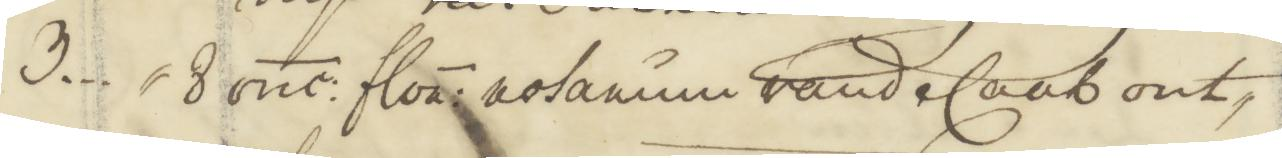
3.-. „ 8 onc: flor: rosarum vande Caab ont„
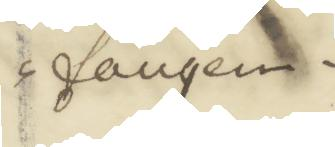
„fangen
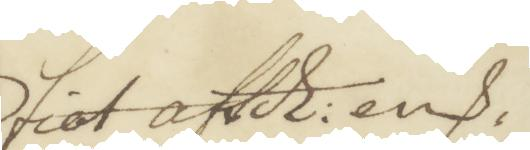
fiat afsch: en ver„
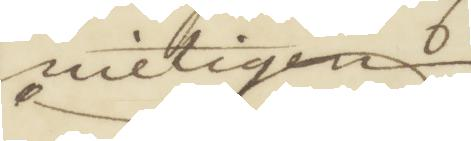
nietigen
